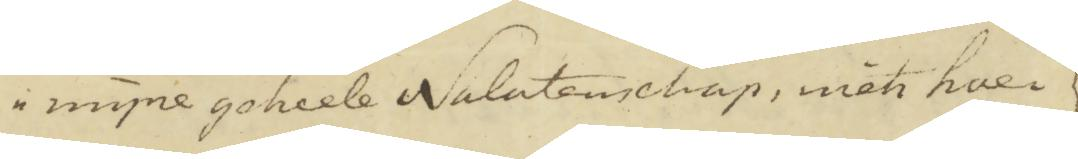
„mijne geheele Nalatenschap, niets hoe-
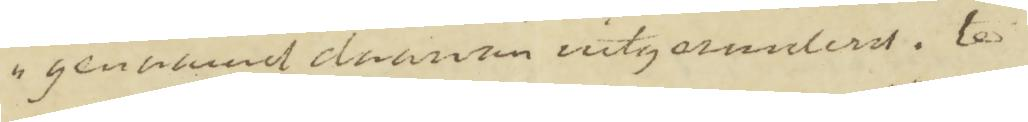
„genaamd daarvan uitgermderd. te
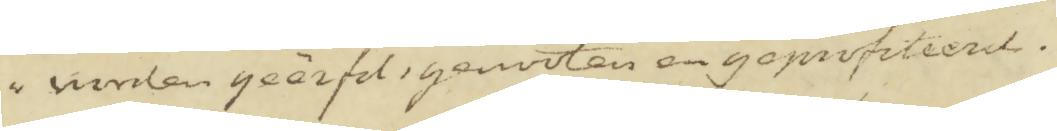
„worden geërfd, genooten en geprofiteerd.
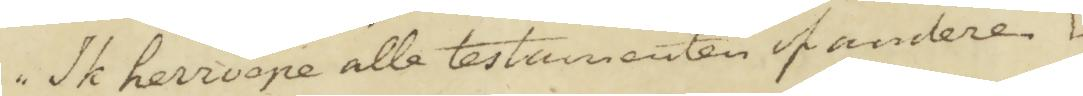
„ Ik herroepe alle testamenten of andere
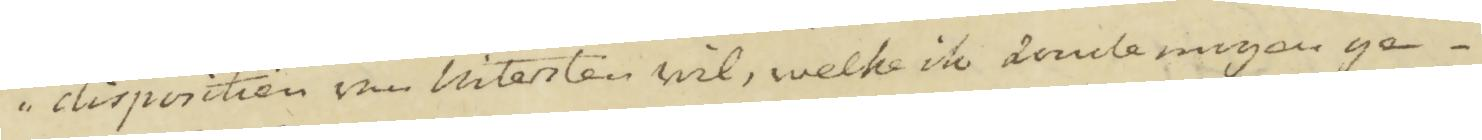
„dispositien van uitersten wil, welke ik zoude mogen ge-
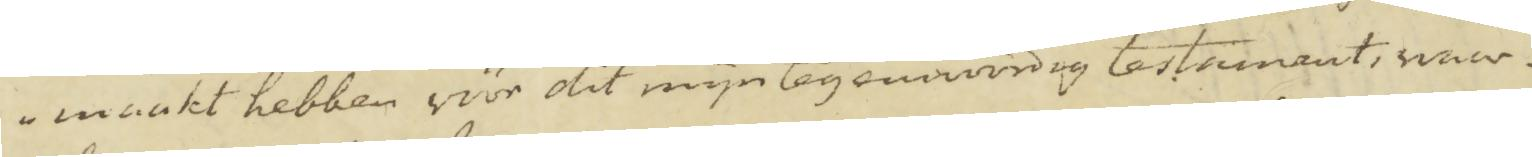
„maakt hebben vóór dit mijn tegenwoordig testament, waar-
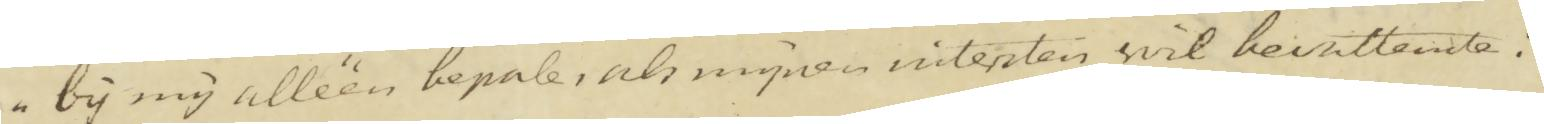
„ bij mij alléén bepale, als mijnen uitersten wil bevattende."
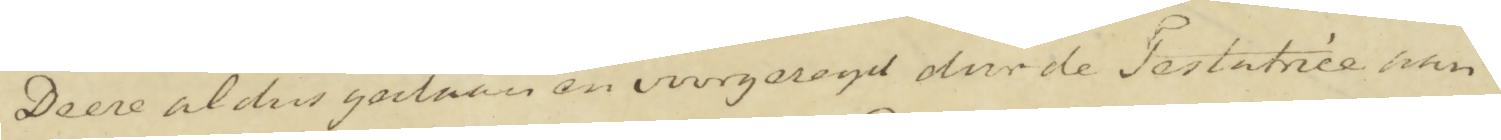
Deeze aldus gedaan en voorgezegd door de Testatrice aan
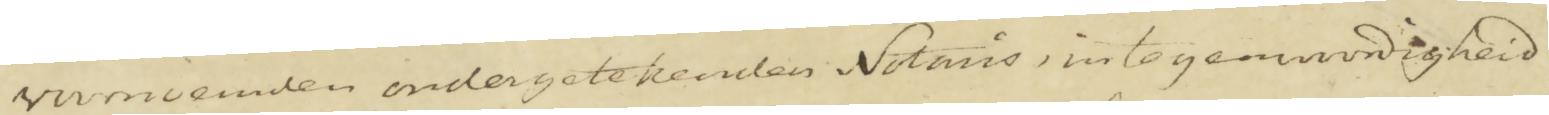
voornoemden ondergetekenden Notaris, in tegenwoordigheid
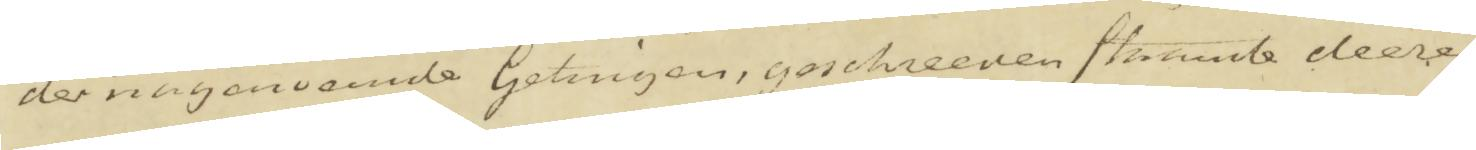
der nagenoemde Getuigen, geschreeven staande deeze
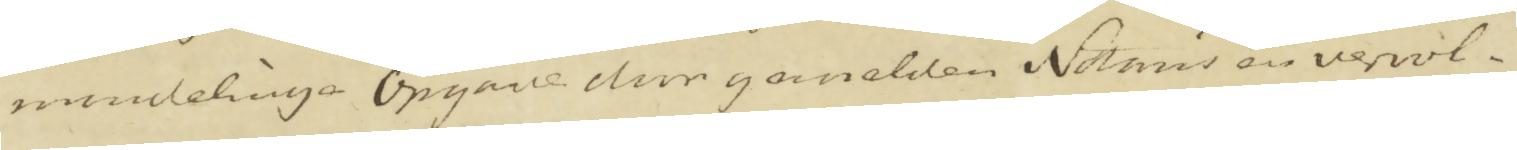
mondelinge Opgave door gemelden Notaris en vervol-
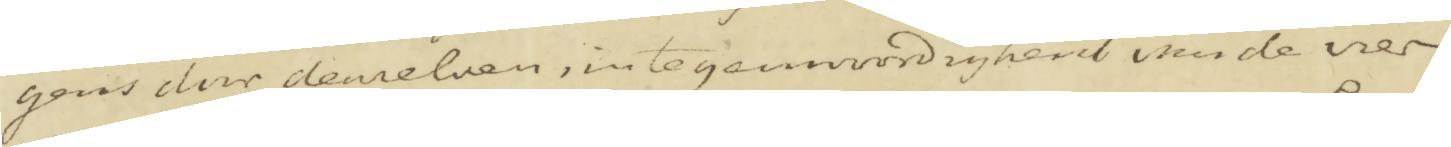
gens door denzelven, in tegenwoordigheid van de vier
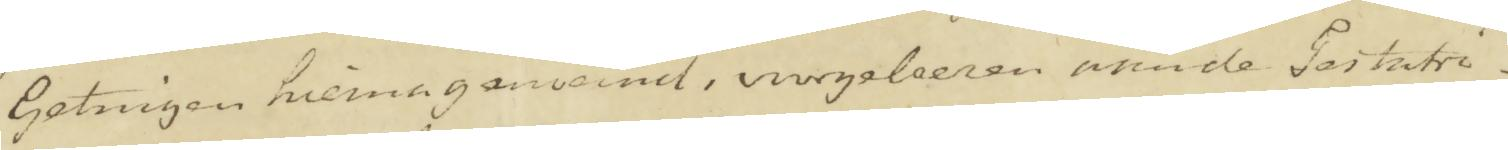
Getuigen hierna gemeend, voorgeleezen aan de Testatri
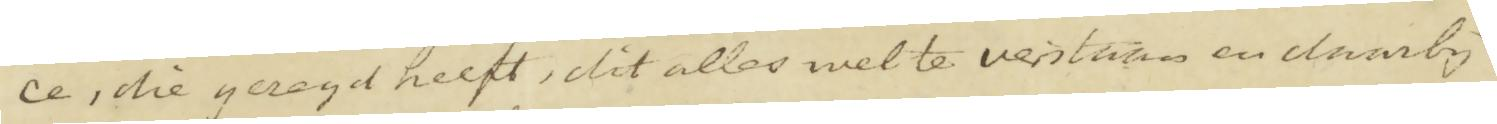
ce, die gezegd heeft, dit alles wel te verstaan en daarbij
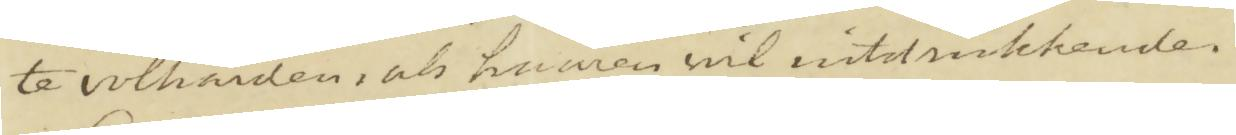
te volharden, als haaren wil uitdrukkende
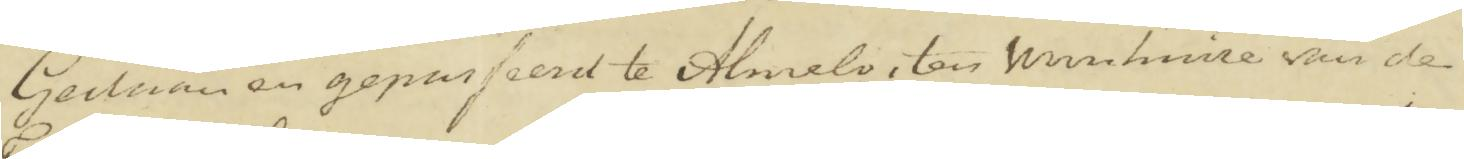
Gedaan en gepasseerd te Almelo, ten woonhuize van de
